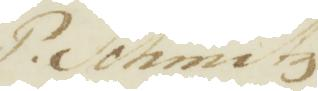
P. Schmitz
